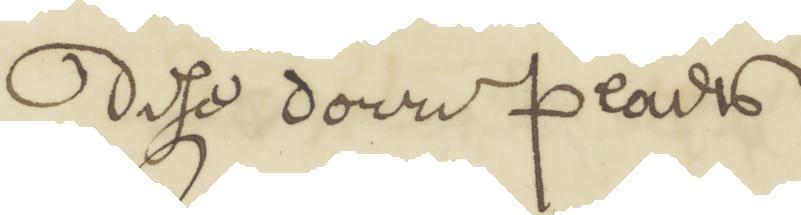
dese dorre plaets
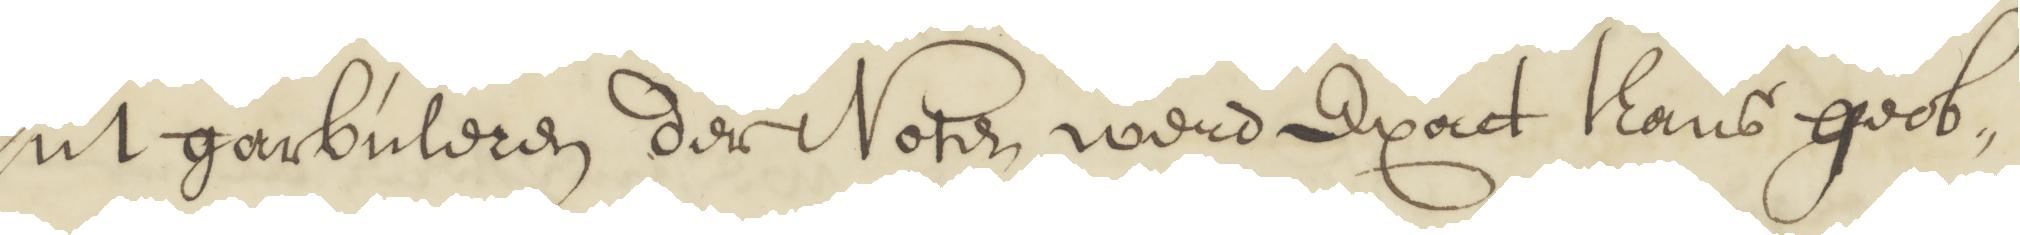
Jn’t garbuleren der Noten werd Exact thans geob„
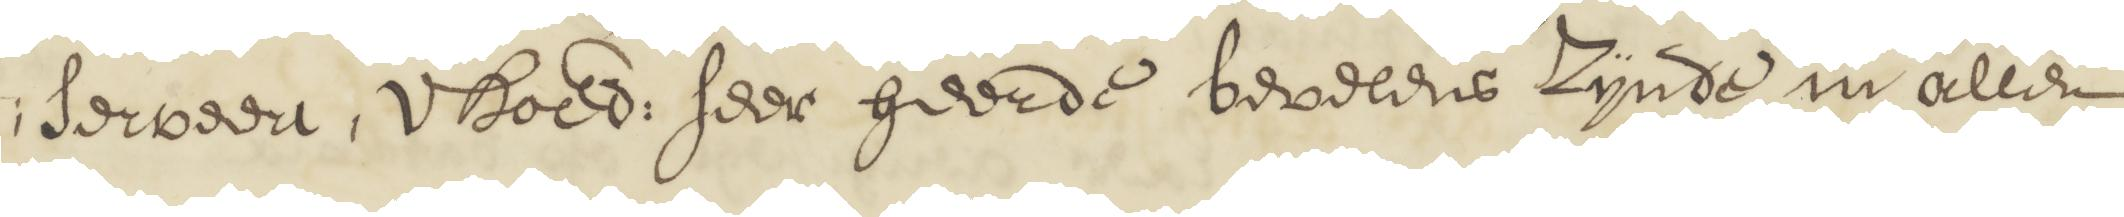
:serveert, VHoEd: seer g'eerde bevelens zijnde in allen
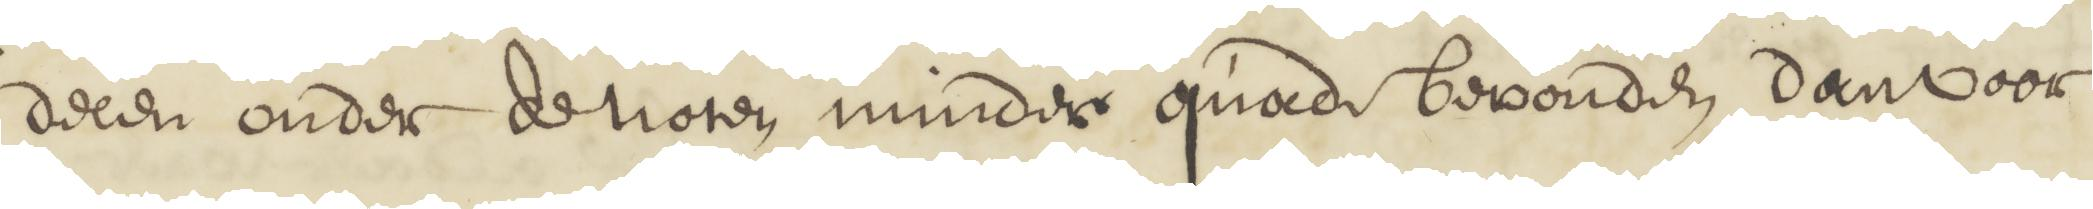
delen onder de noten minder quade bevonden dan voor
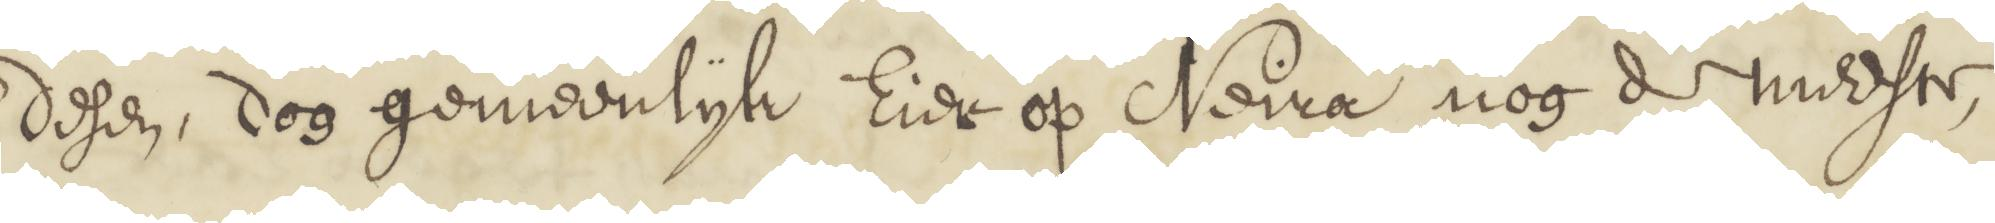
desen, dog gemeenlijk hier op Neira nog de meeste,
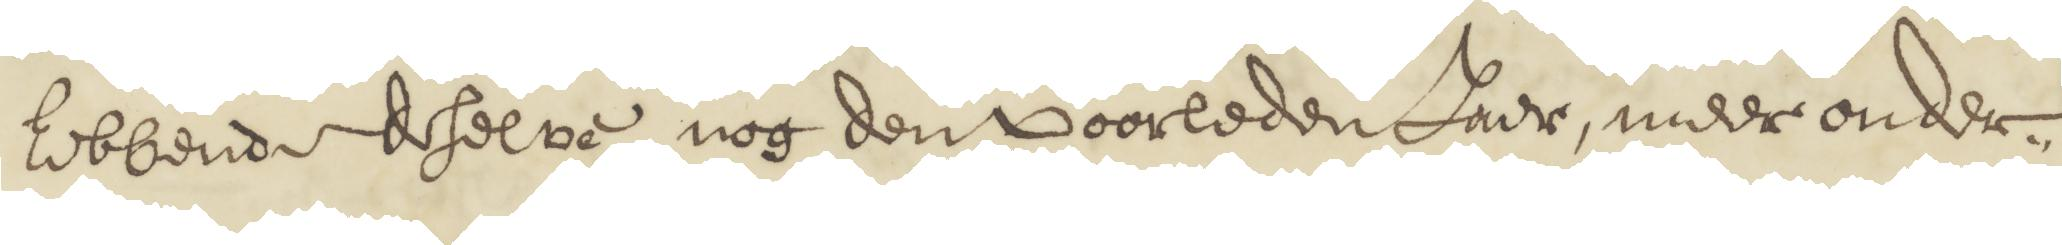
hebbende deselve nog den voorleden Iaer, meer onder„
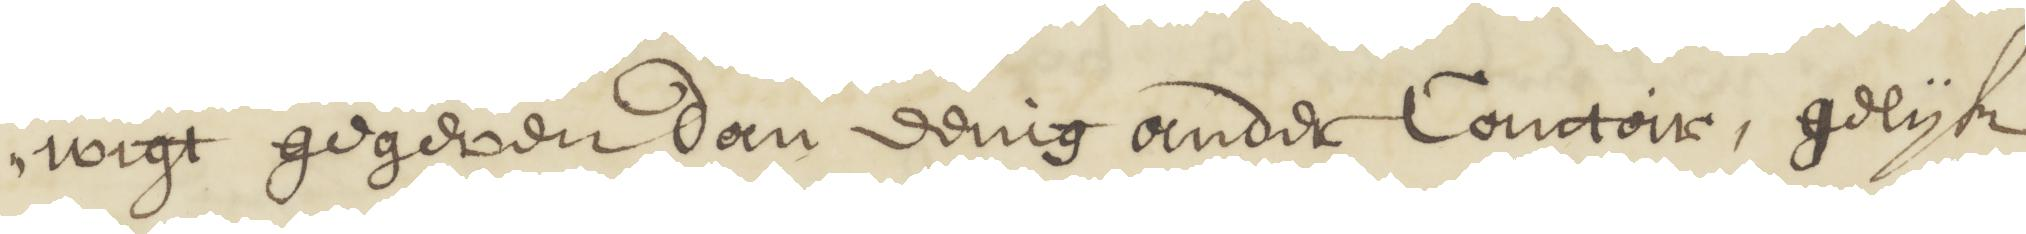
„wigt gegeven dan eenig ander Comtoir, gelijk
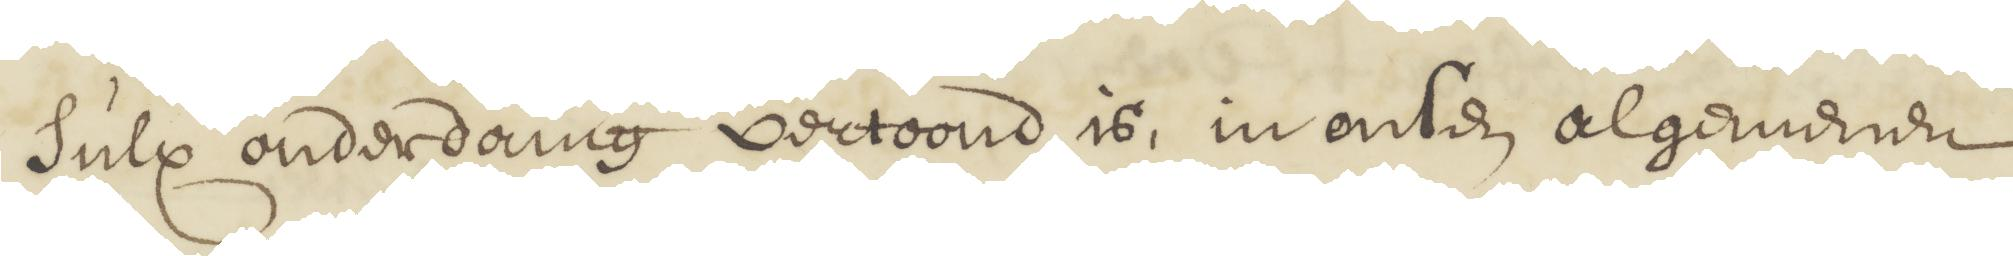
sulx onderdanig vertoond is, in onsen algemenen
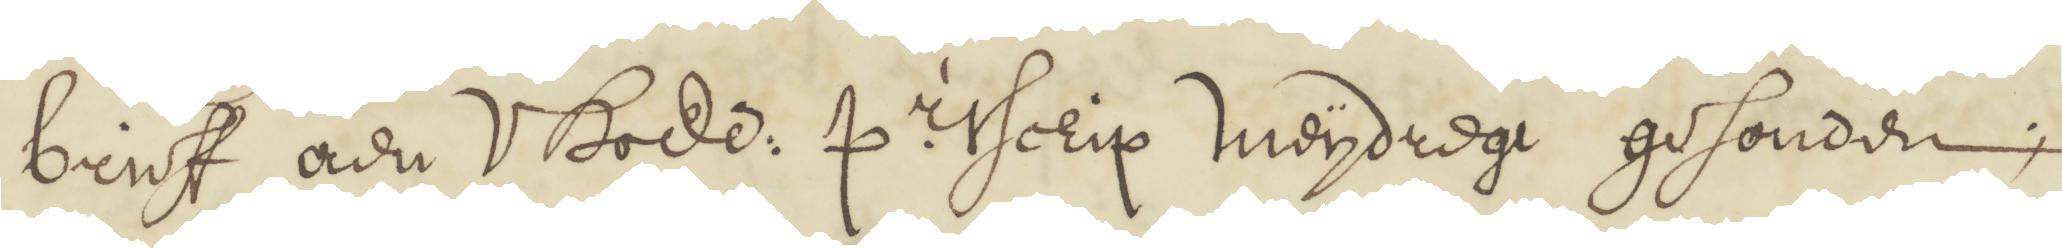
brieff aen VHoEd: p.r't schip meijdregt gesonden;
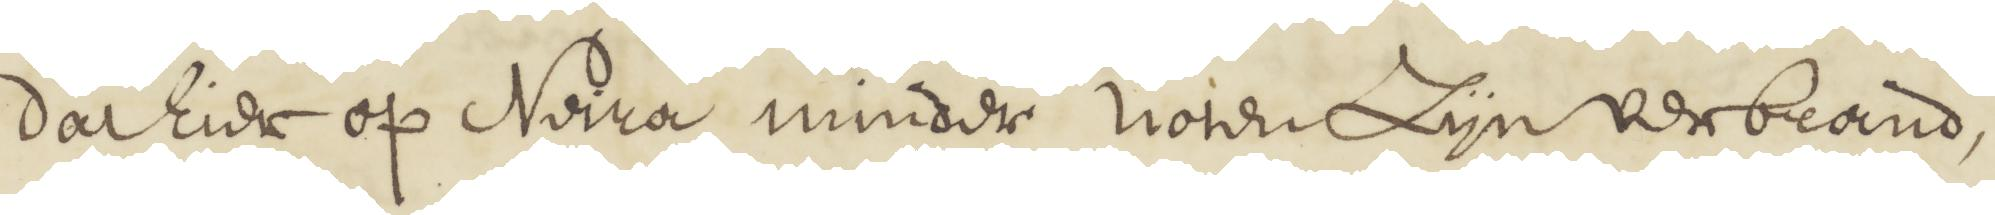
dat hier op Neira minder noten zijn verbrand,
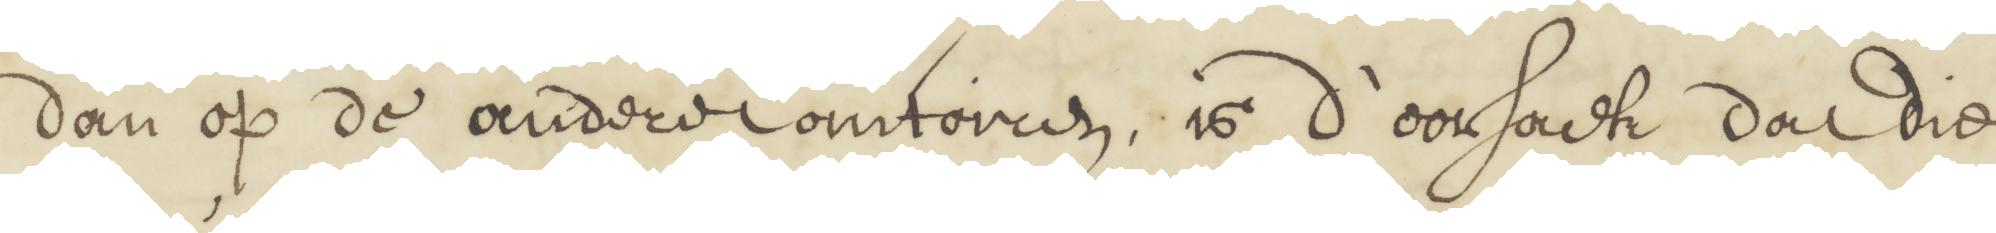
dan op de andere comtoiren, is d’ oorsaek dat die
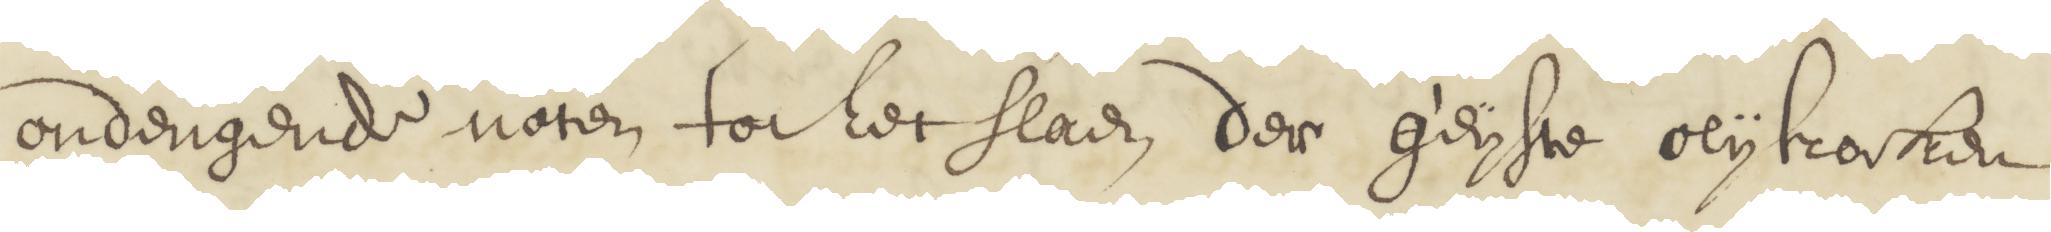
ondeugende noten tot het slaen der g'eijste olijkoeken
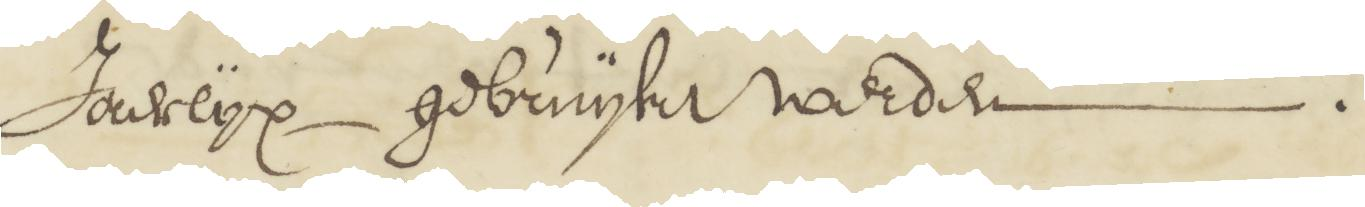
Iaerlijx gebruijkt werden.
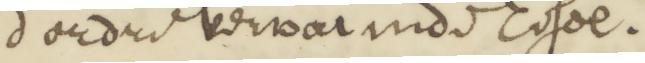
d’ordre vervat inde resol.
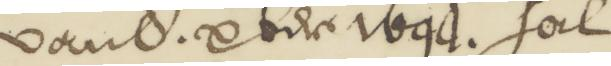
van 8. xber 1694. sal
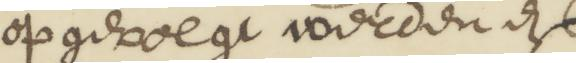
opgevolgt werden en
